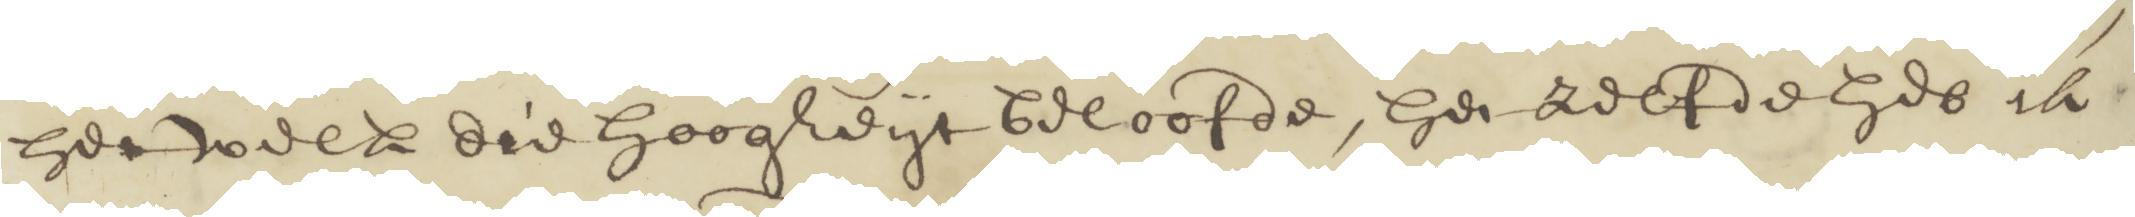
het welk die hoogheijt beloofde, het zelfde heb ik
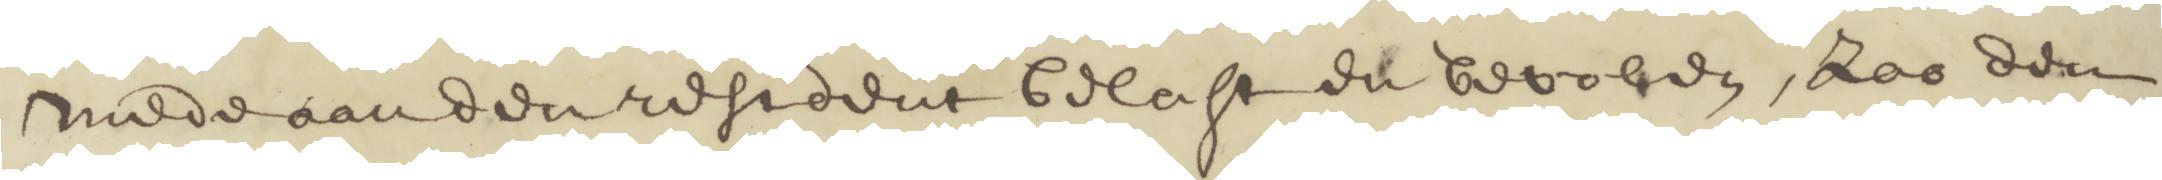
mede aan den resident belast en bevolen, zoo den
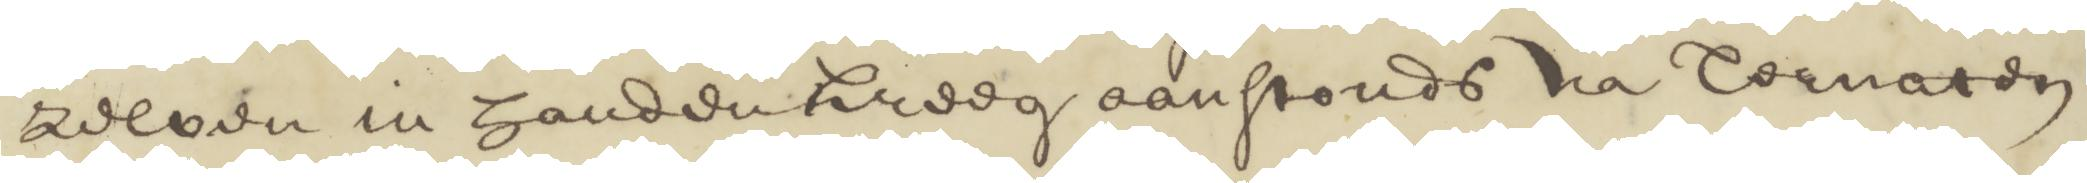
zelven in handen kreeg aanstonds na Ternaten
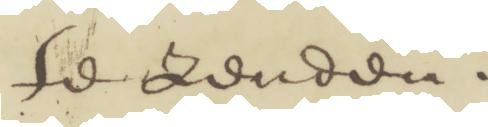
te zenden.
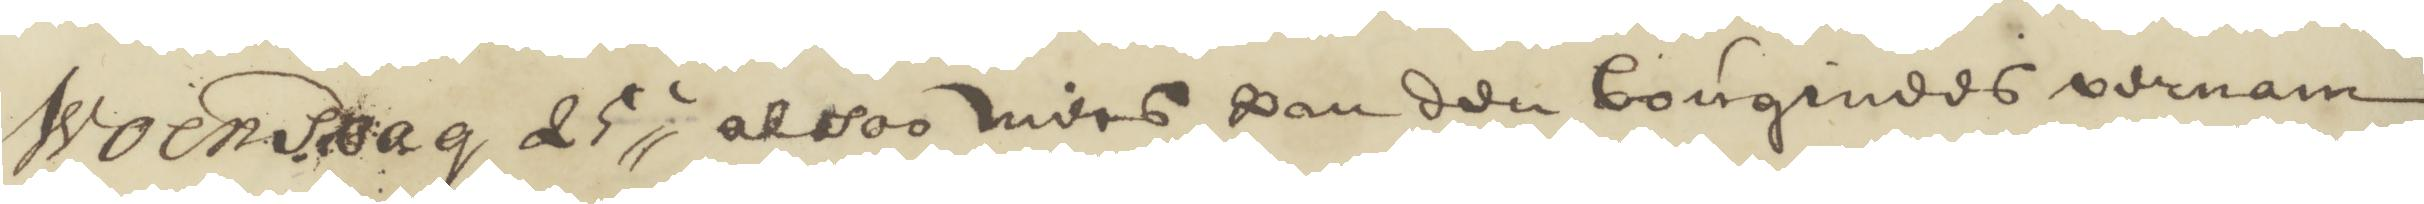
Woensdag 25„' alsoo niets van den bouginees vernam
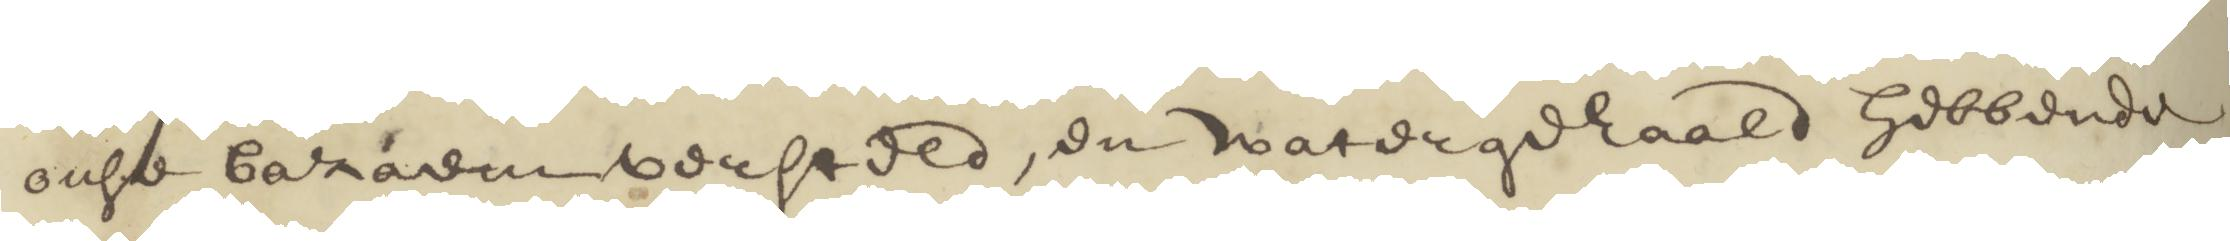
onse bazaem versteld, en water gehaald hebbende
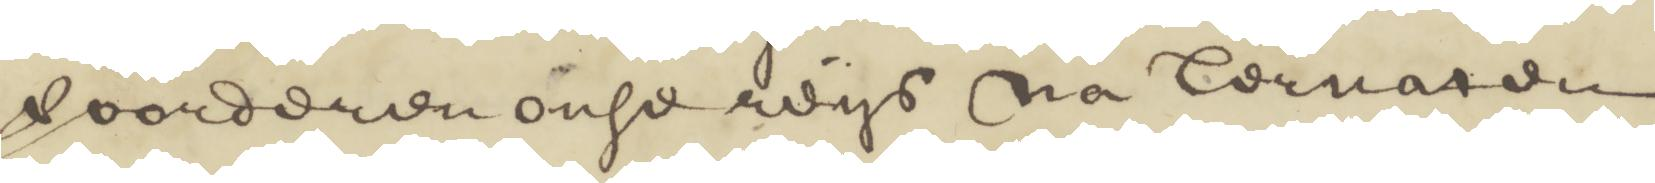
vervorderen onse reijs na Ternaten
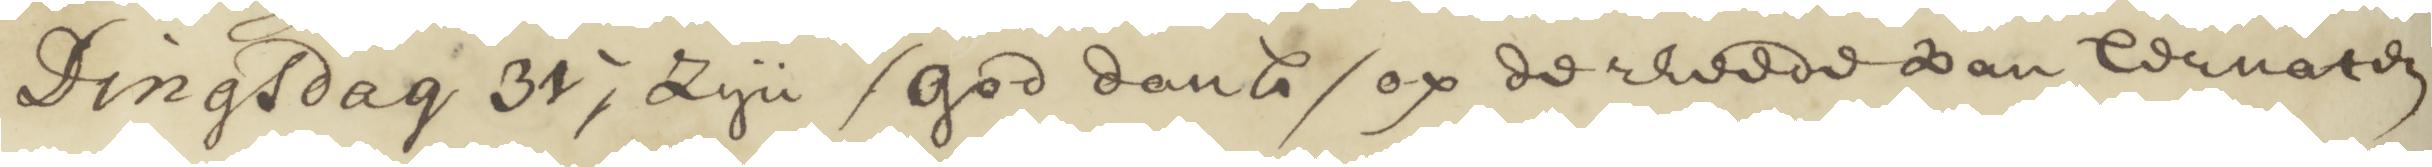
Dingsdag 31„' zijn /God dank/ op de rheede van Ternaten
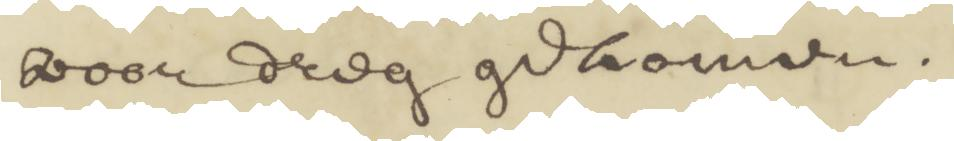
voor dreg gekomen.
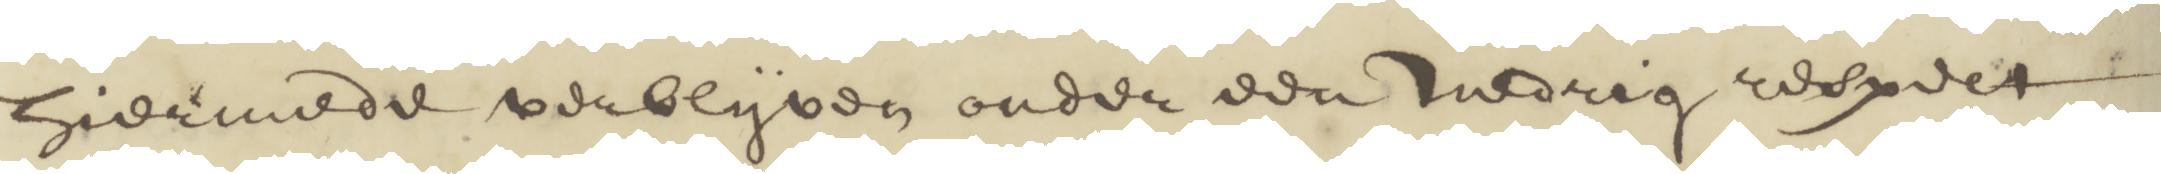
Hiermede verblijven onder een nedrig respect
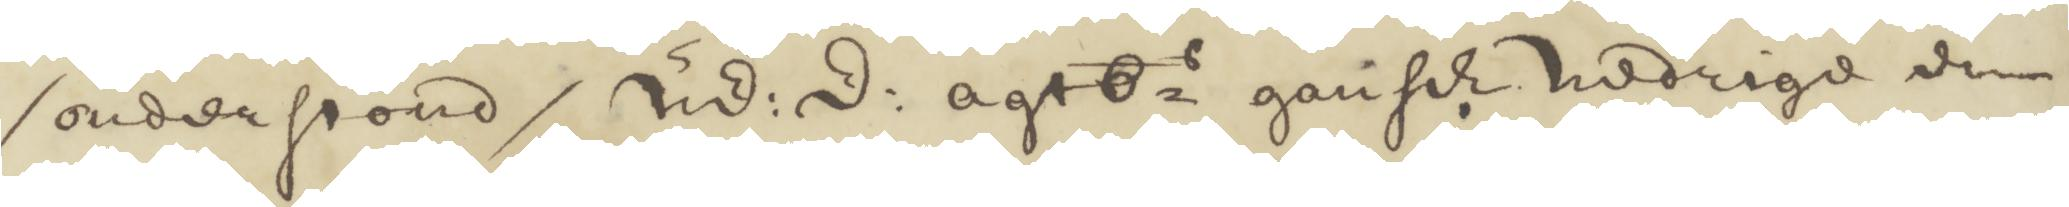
/onderstond/ uE: E: agtb=s gansch nedrige en
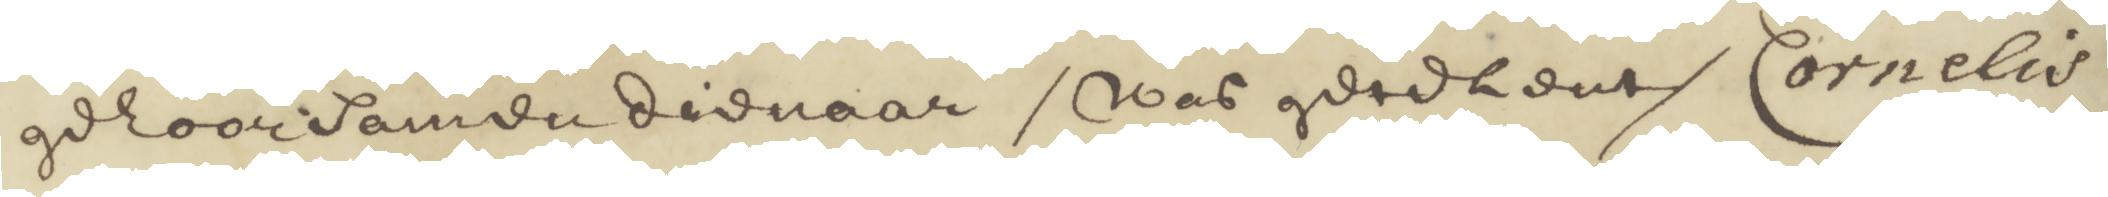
gehoorsamen dienaar /was getekent/ Cornelis
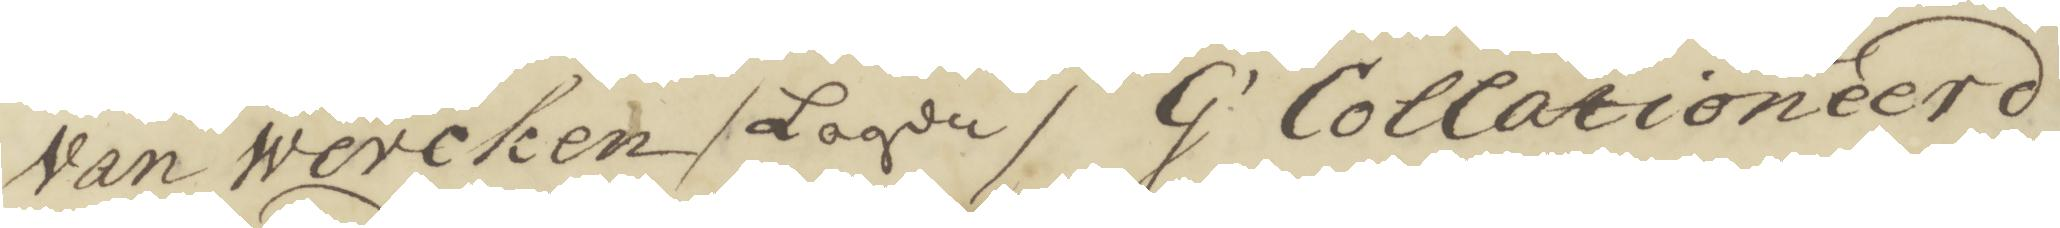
van wercken/ lager/ G'Collationeerd
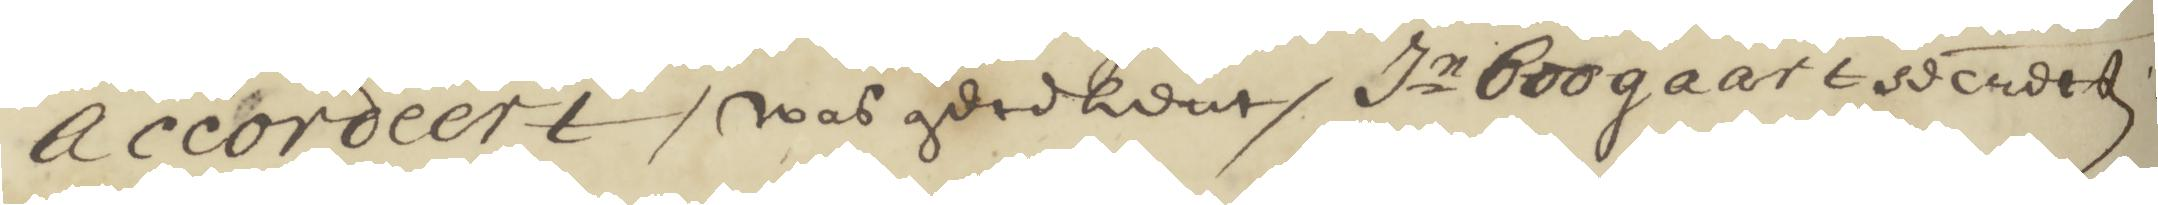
accordeert /was getekent/ I=n boogaart secret:
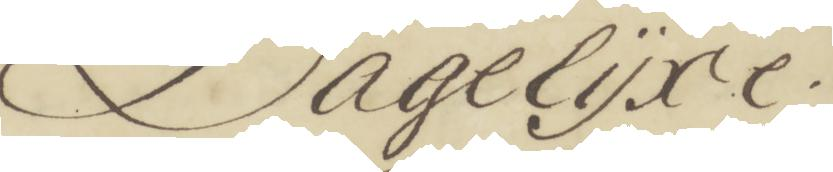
Dagelijxe.
